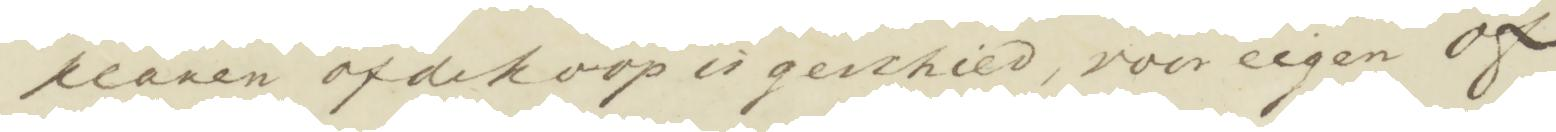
klaren of de koop is geschied, voor eigen of
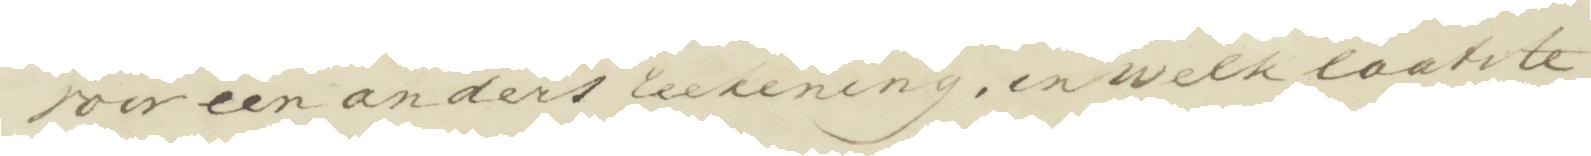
voor een anders reekening, in welk laatste
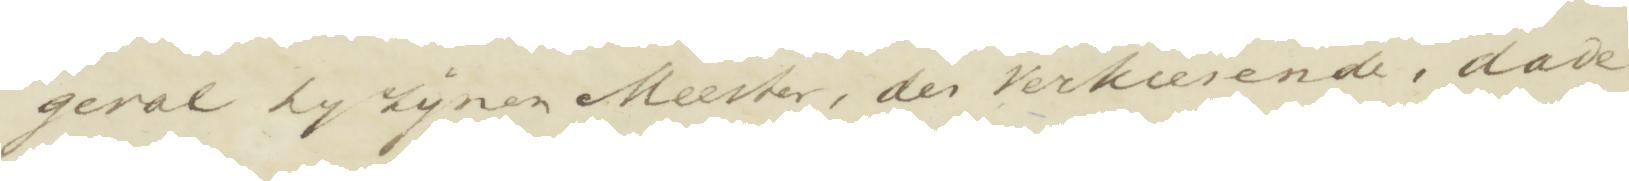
geval hy zijnen Meester, des verkiesende, dade
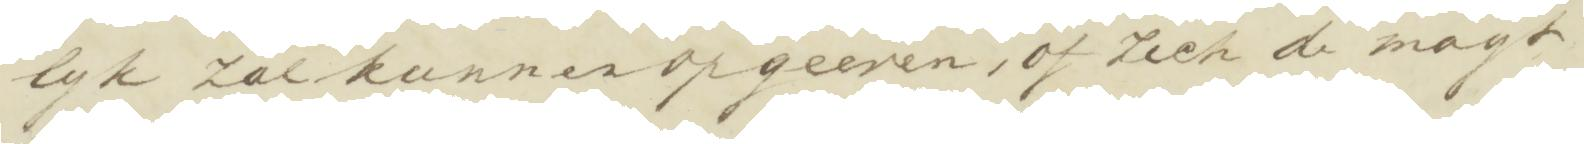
lyk zal kunnen opgeeven, of zich de magt
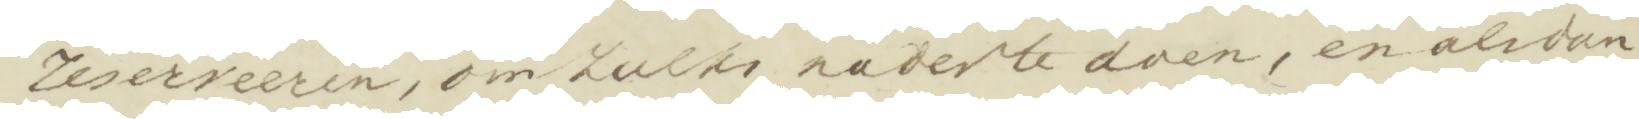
reserveeren, om zulks nader te doen, en als dan
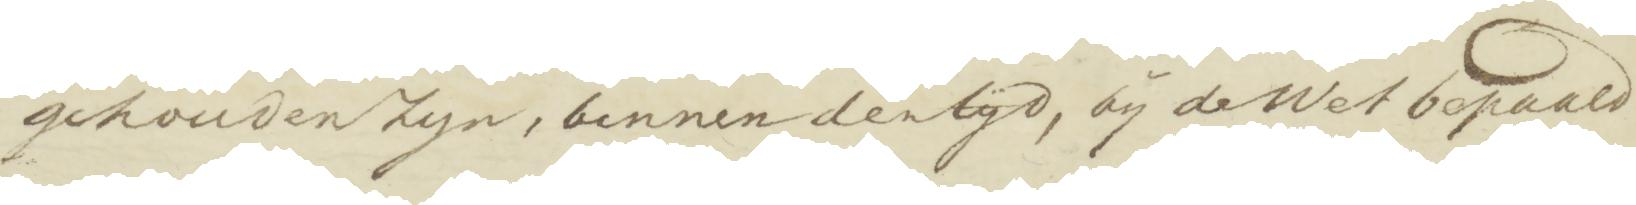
gehouden zyn, binnen den tijd, bij de Wet bepaald
